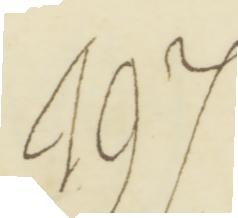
497
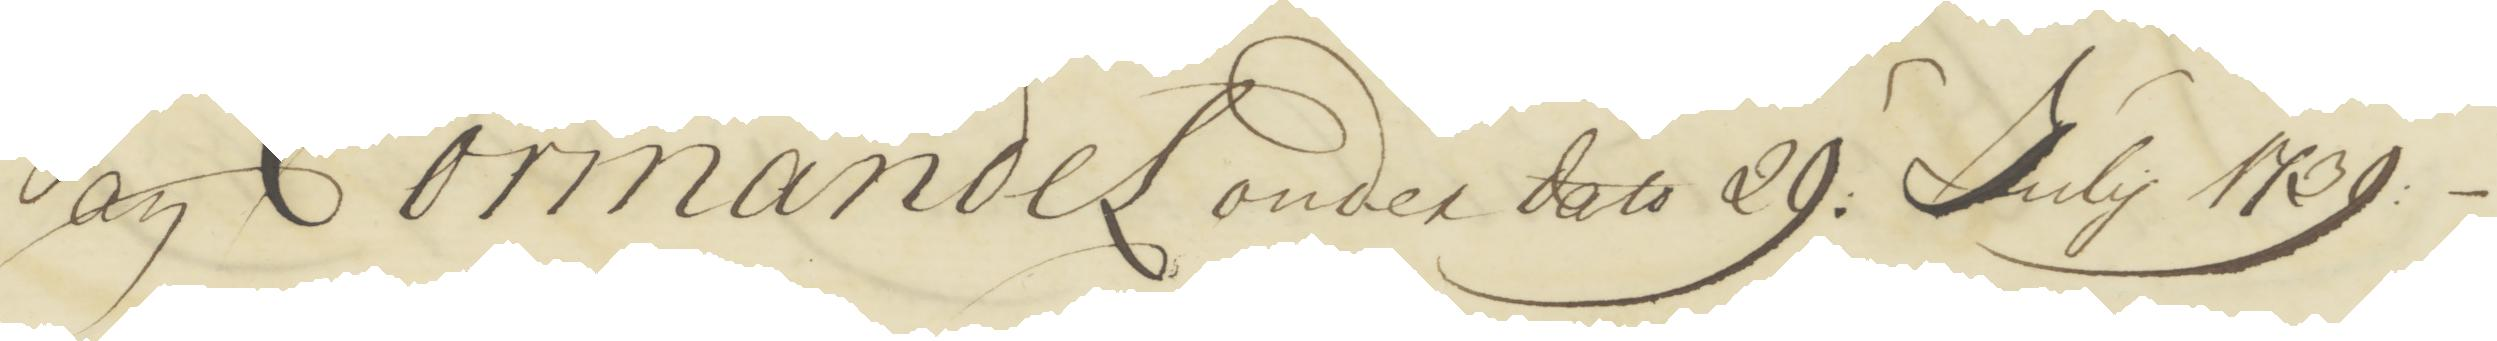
Van Cormandel onder dato 29:' Julij 1739: -
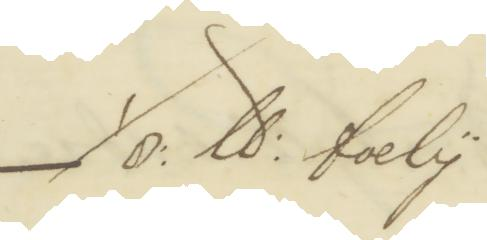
— 1/8: lb: foelij
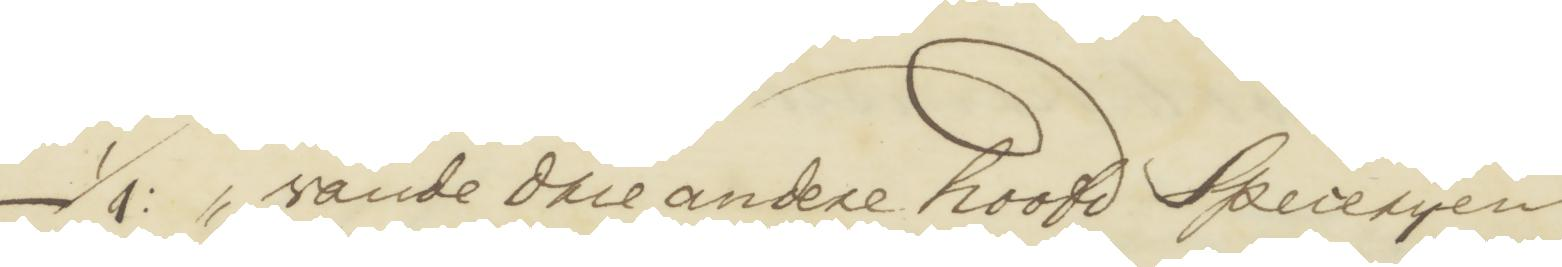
— 1/4: „ vande drie andere hoofd specerijen
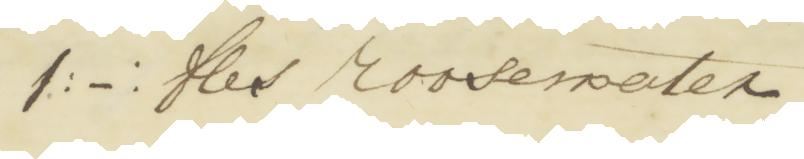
1:-: fles roosewater
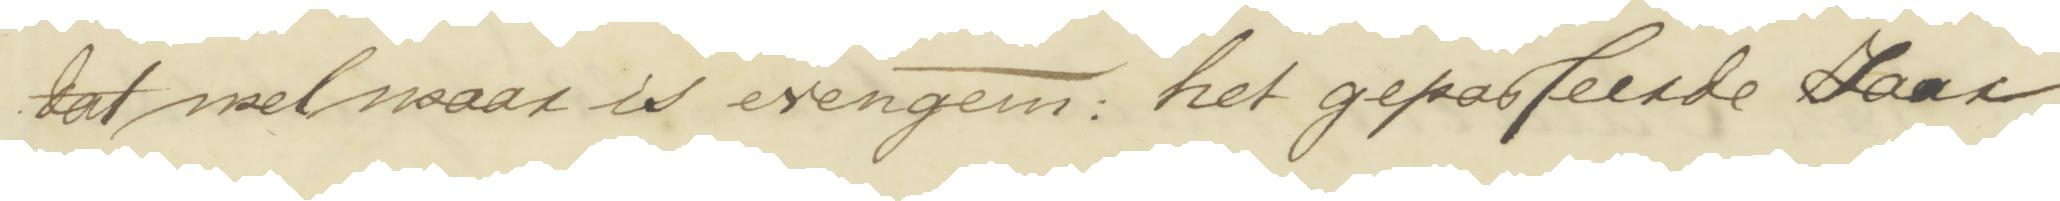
dat welwaar is evengem: het gepasseerde Iaar
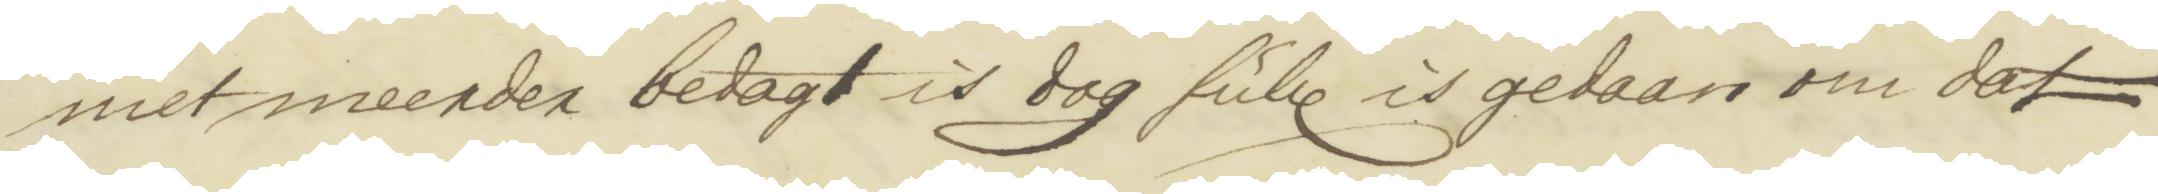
met meerder bedagt is dog sulx is gedaan om dat
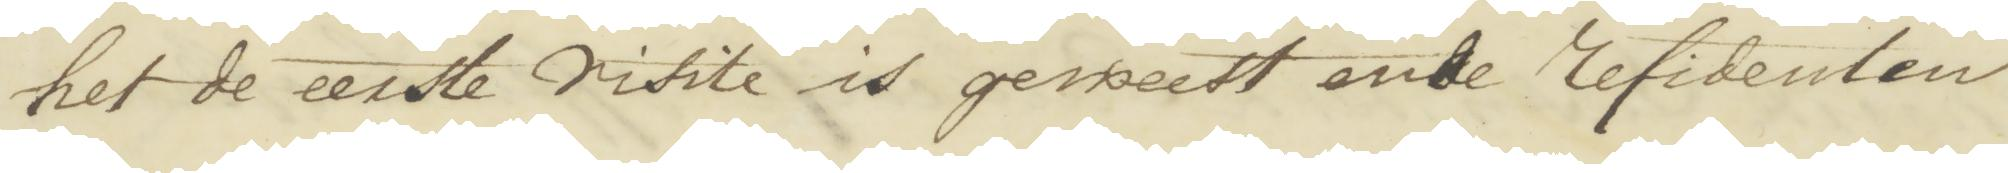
het de eerste visite is geweest ende Residenten
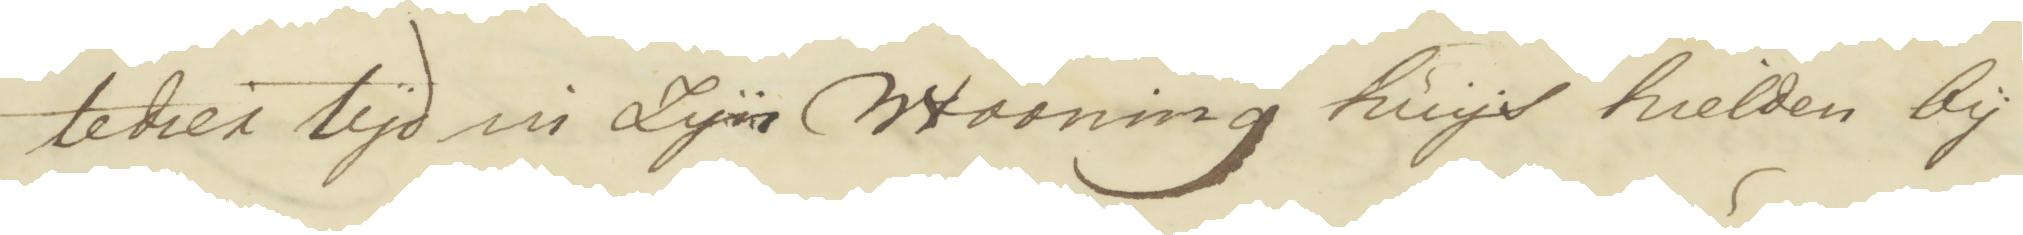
tedier tijd in zijn wooning huijs hielden bij
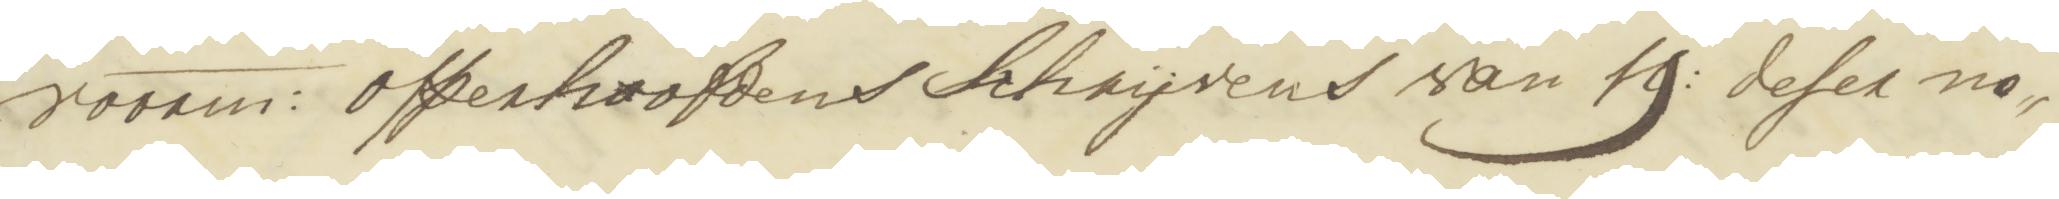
voorm: opperhoofdens schrijvens van 19:' deser no„
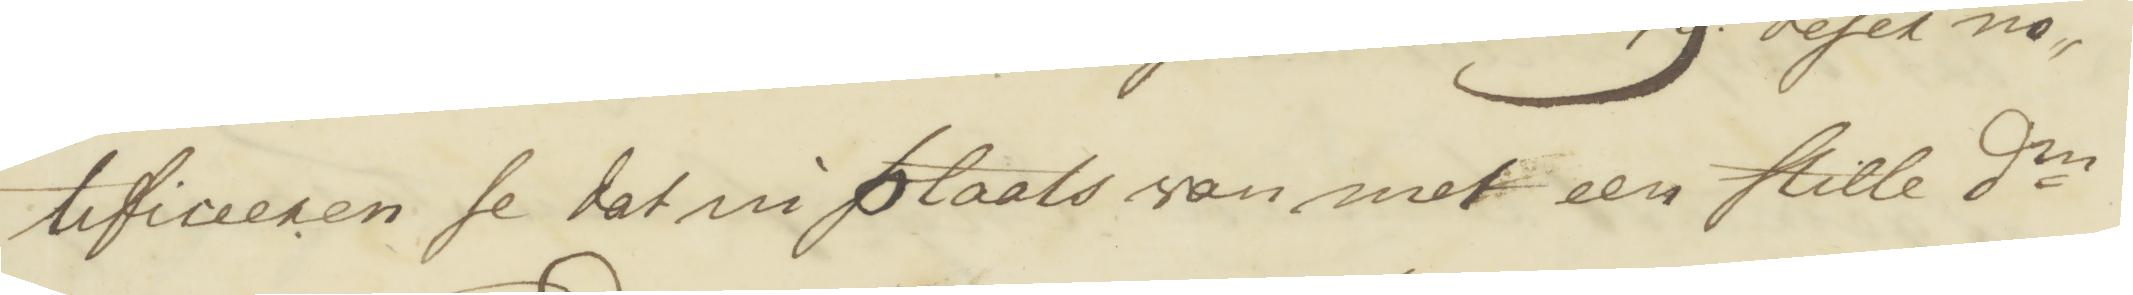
tificeeren se dat in plaats van met een stille d=m
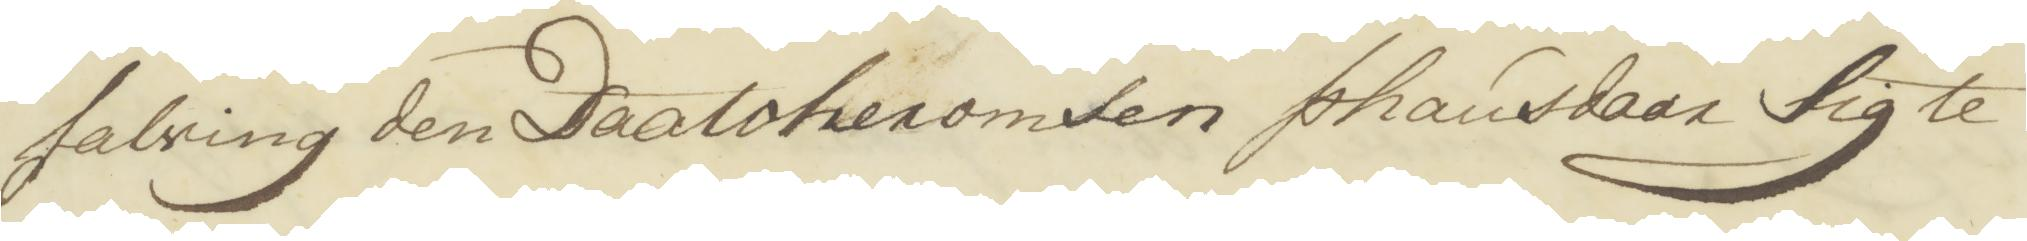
salving den Daatoheromsen phausdaar sig te
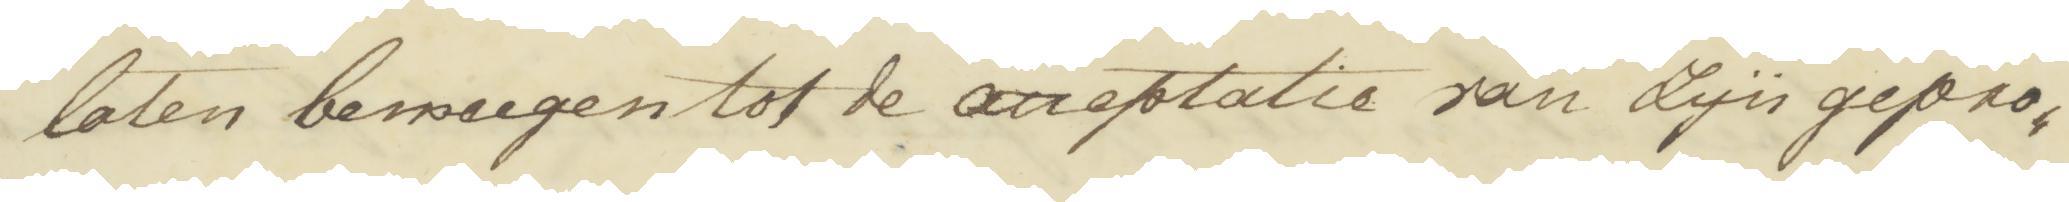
laten beweegen tot de acceptatie van zijn gepro„
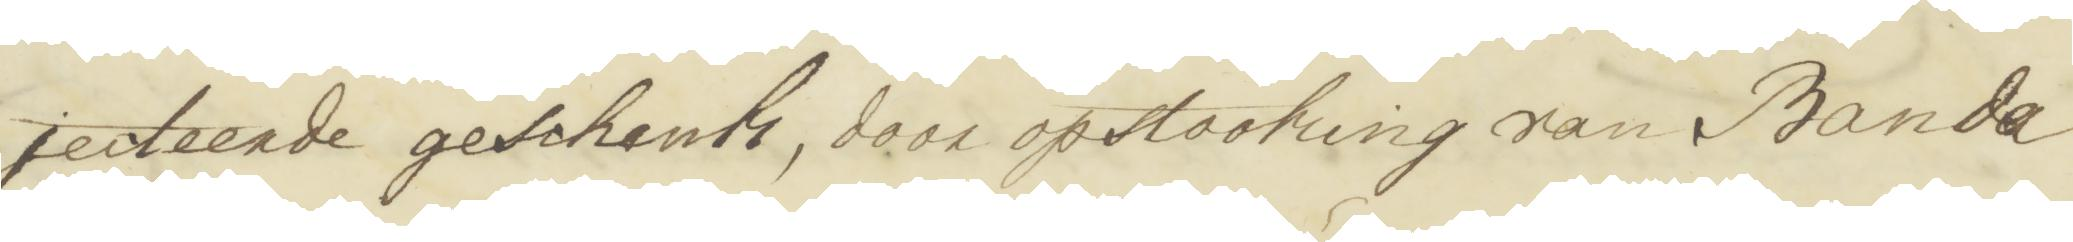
jecteerde geschenk, door opstooking van Banda
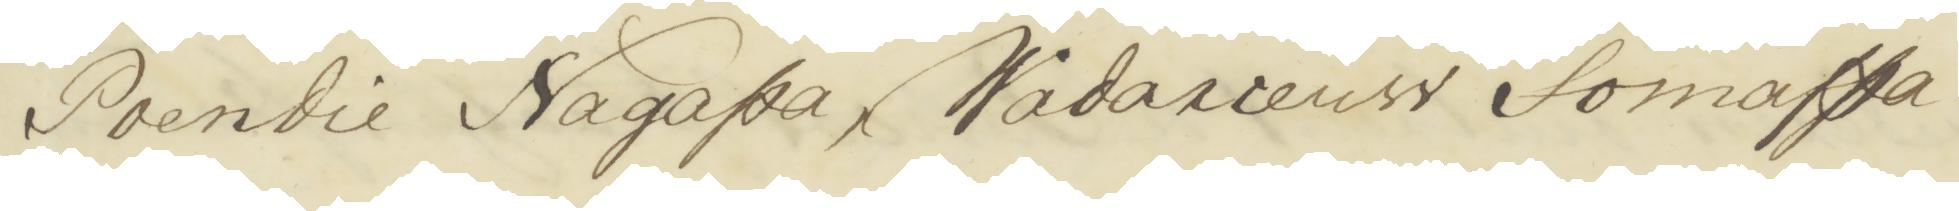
Poendie Nagapa, Wadarieuw somappa
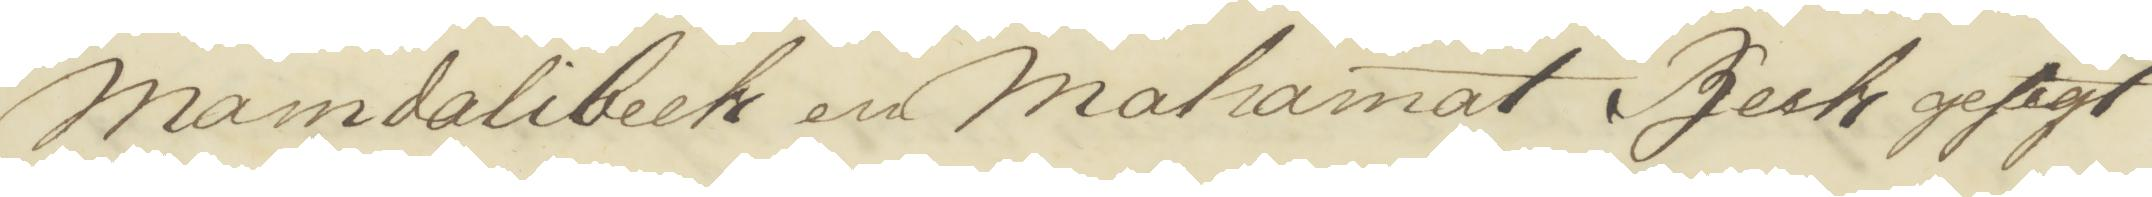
Mamdalibeek en Mahamat Beek gesegt
